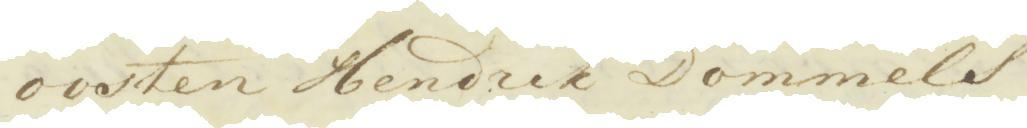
oosten Hendrik Dommels
